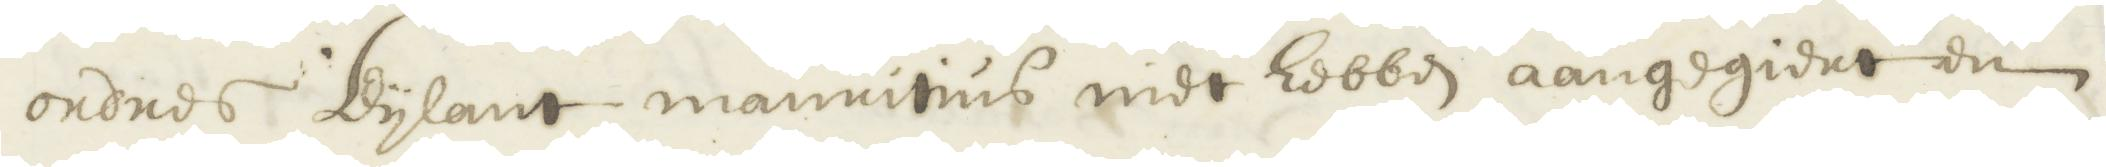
ordres 'tEijlant mauritius niet hebben aangegiert en
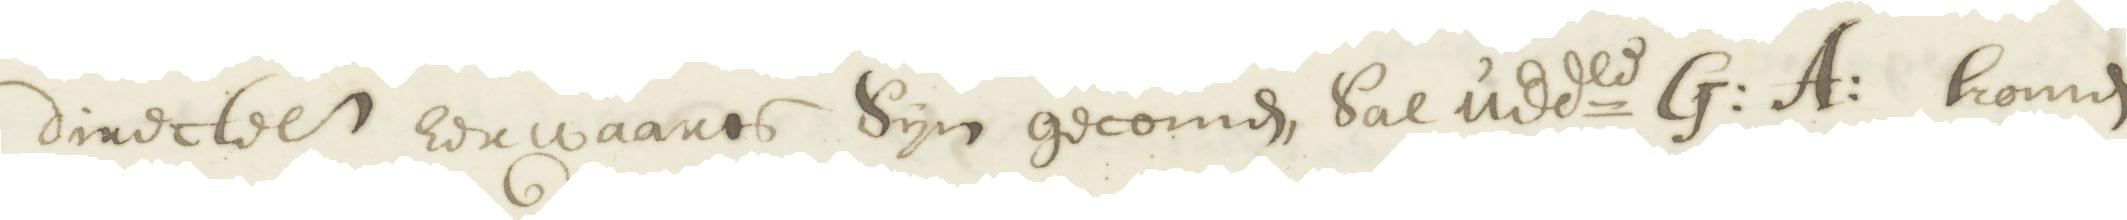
directelijk herwaarts sijn gecomen, sal uEd=le G:A: komen
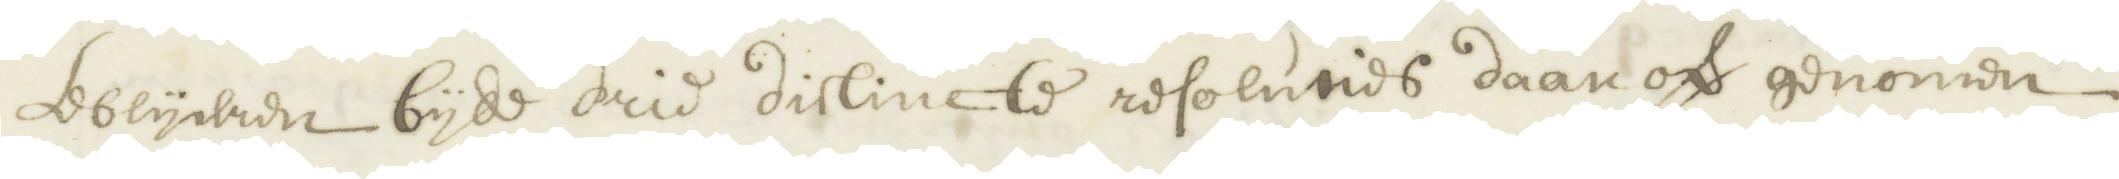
teblijcken bij de drie distincte resoluties daar over genomen
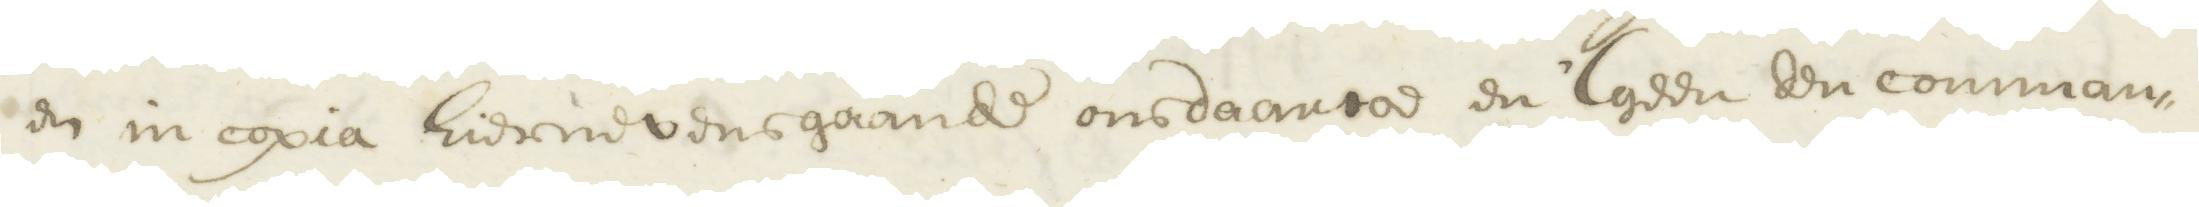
en in copia hiernevensgaande ons daartoe en 'tgeen den comman„
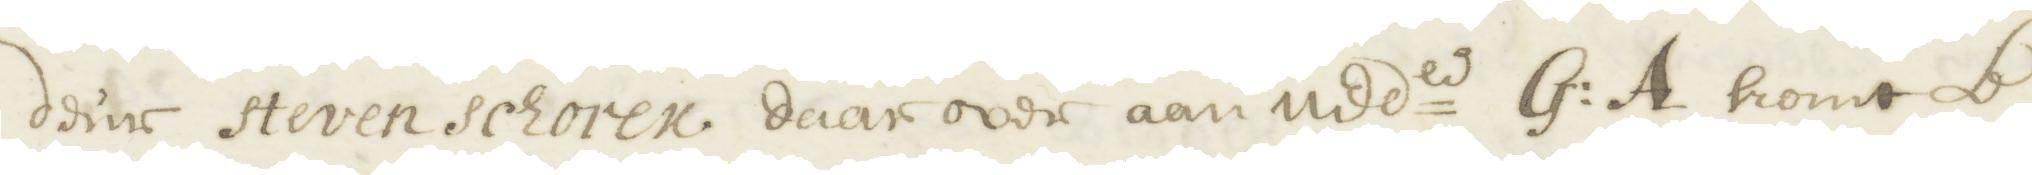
deur steven schoren daar over aan uEd=le G:A komt te
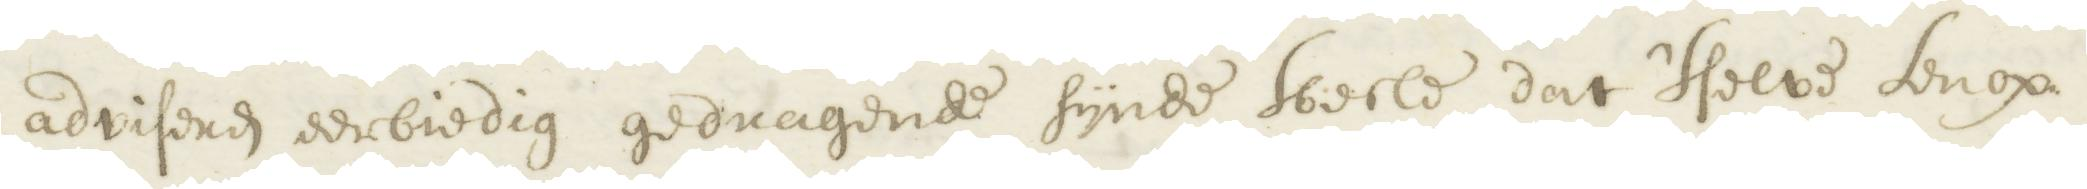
adviseren eerbiedig gedragende sijnde tbeste dat 'tselve ten op„
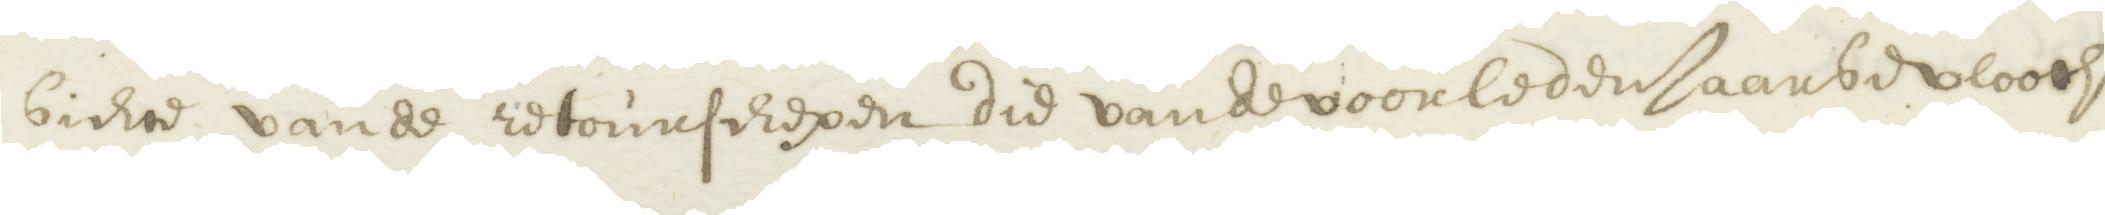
sichte van de retourschepen die van de voorledenjaarse vlooth
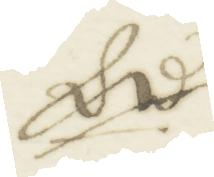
verse
